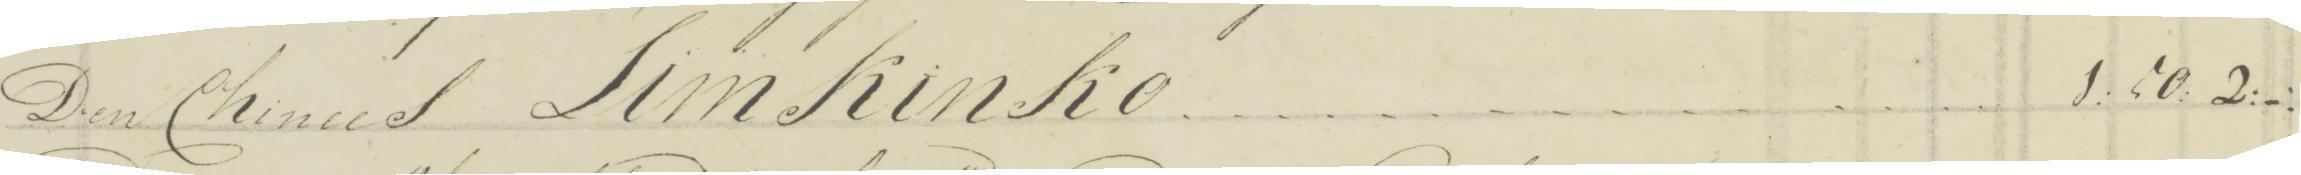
Den Chinees Lim Kin Ko . . . . . . . . . . . . . . . . 1: 50: 2:_:
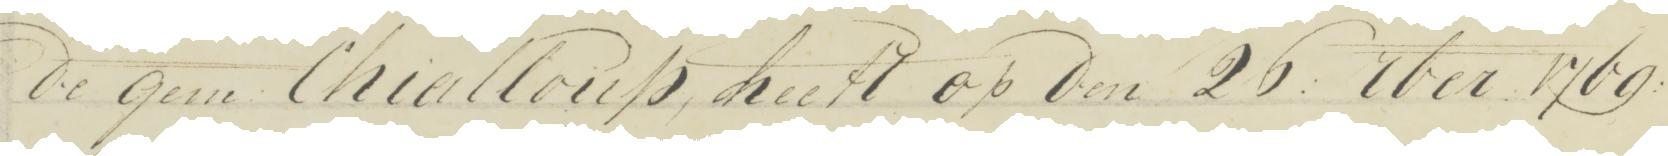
de gem: Chialloup, heeft op den 26: 7ber: 1769:
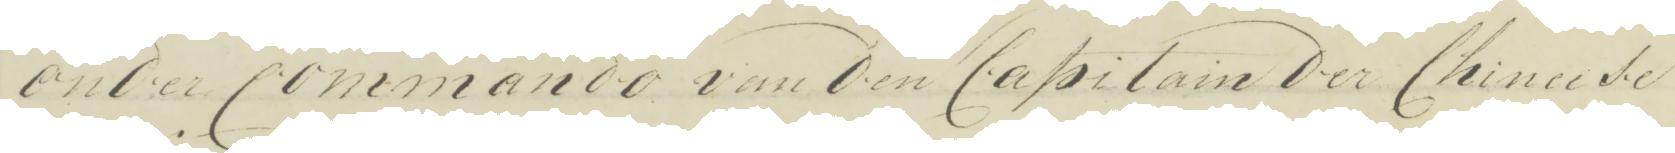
onder Commando van den Capitain der Chineese
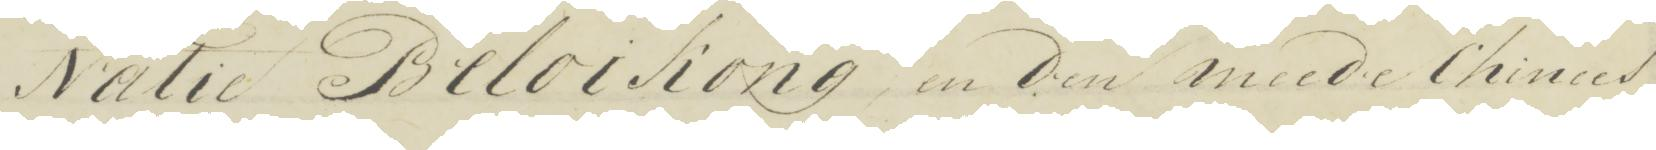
Natie Beloi Kong, en den meede Chinees
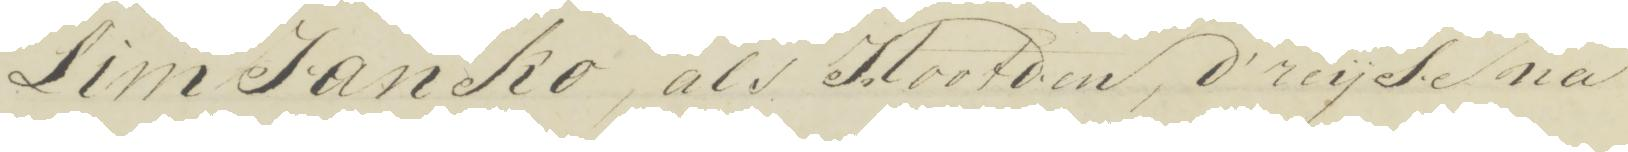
Lim Jan Ko, als Hoofden, d’reijse na
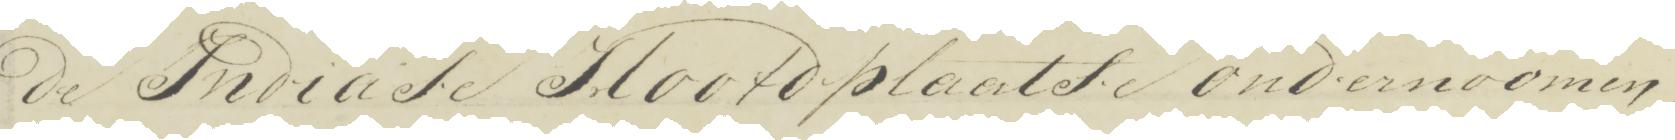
de Indiase Hoofdplaatse ondernoomen
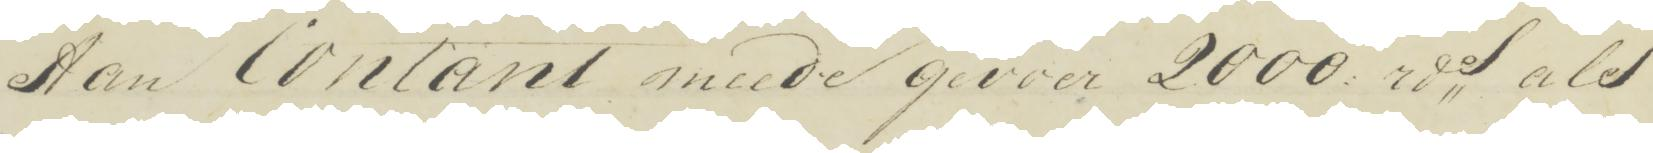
Aan Contant meede gevoer 2000: rd„s als
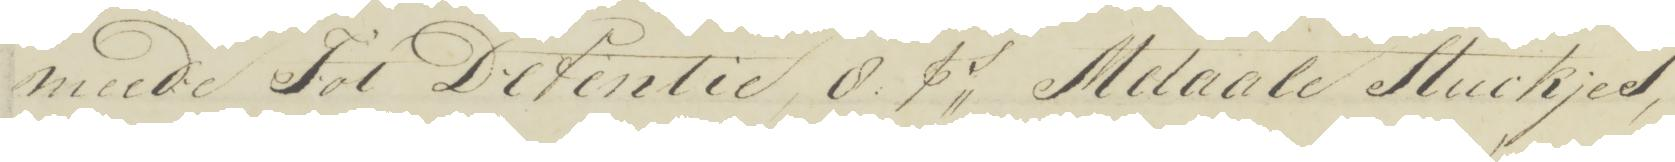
meede Tot Defentie, 8. p„s Metaale Stuckjes,
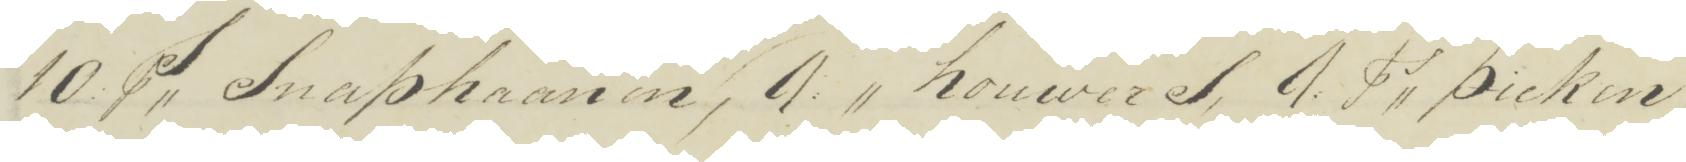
10. p„s Snaphaanen, 4: „ houwers, 4. p„s pieken
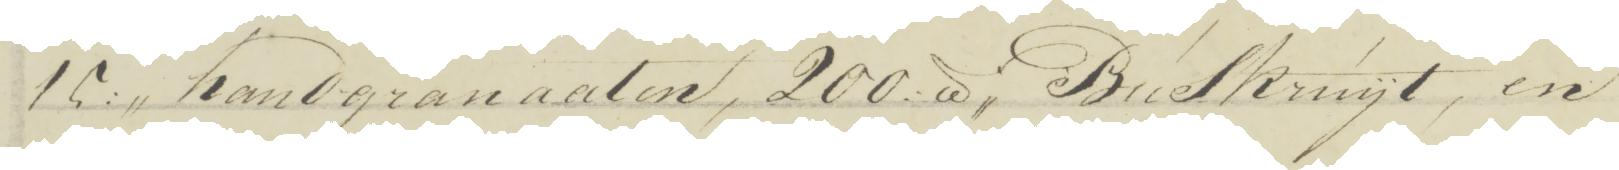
15: „ handgranaaten, 200: id„ Buskruijt, en
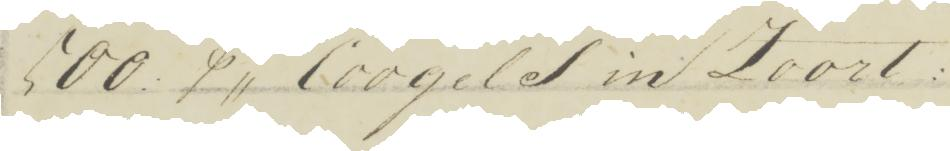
500: p„s Coogels in Zoort:
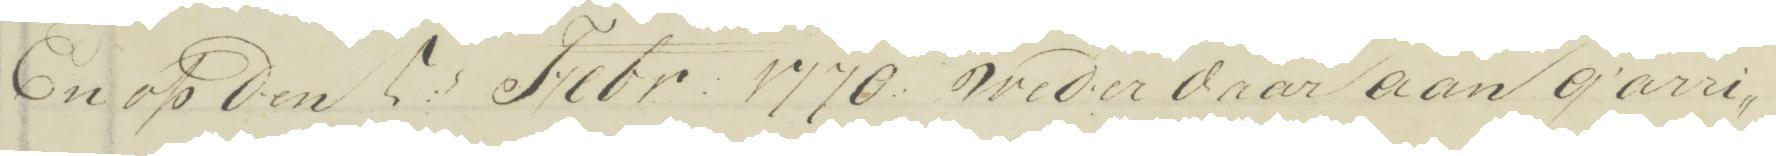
En op den 5:' Febr: 1770: weder daar aan g’arri„
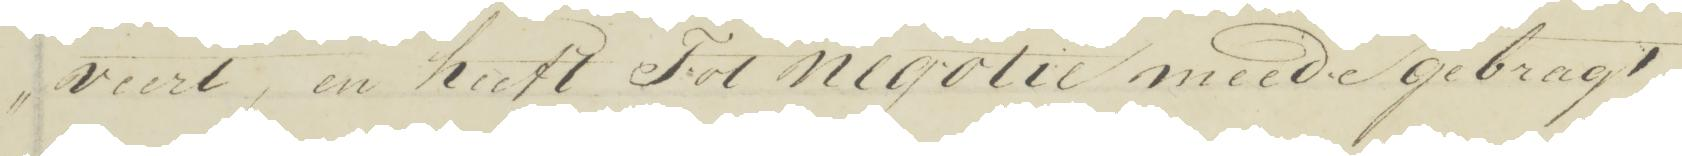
„veert, en heeft Tot negotie meede gebragt;
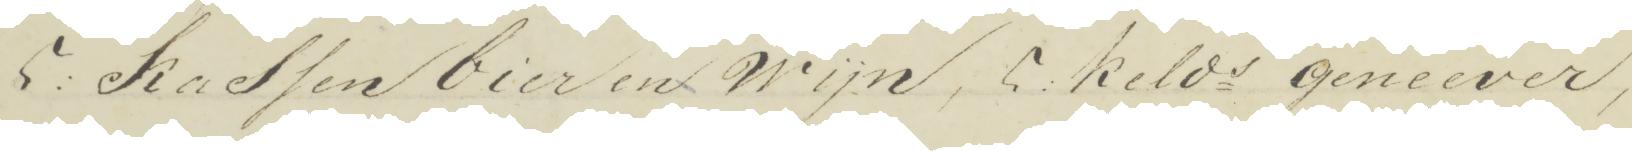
5: Kassen bier en wijn, 5: keld=s geneever,
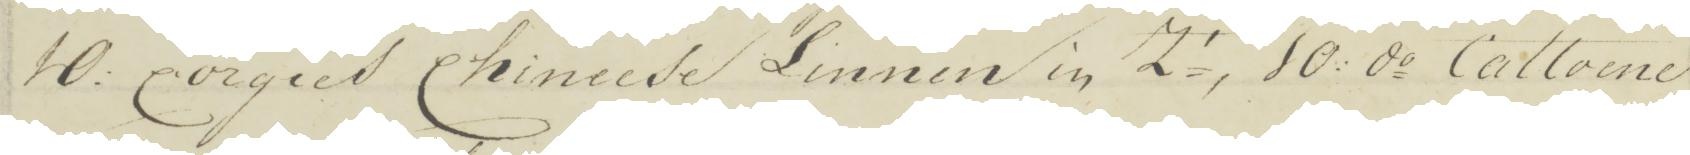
10: Corgies Chineese Linnen in z=t, 10: d=o Cattoene
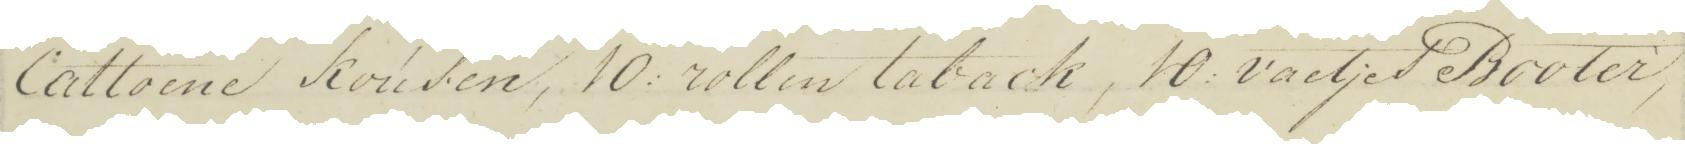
Cattoene kousen, 10: rollen taback, 10: vaetjes Booter,
